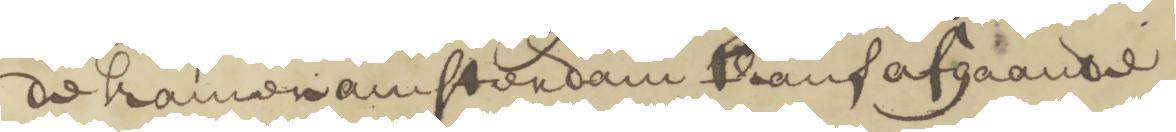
de kamen amsterdam thans afgaande
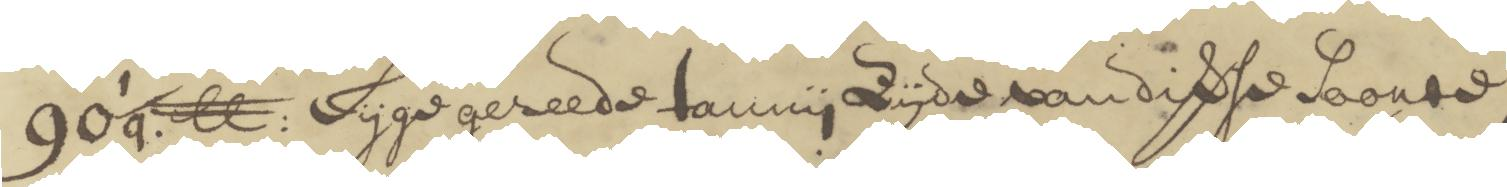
90¼. lb: Eijge gereede tannij zijde van diverse soorte
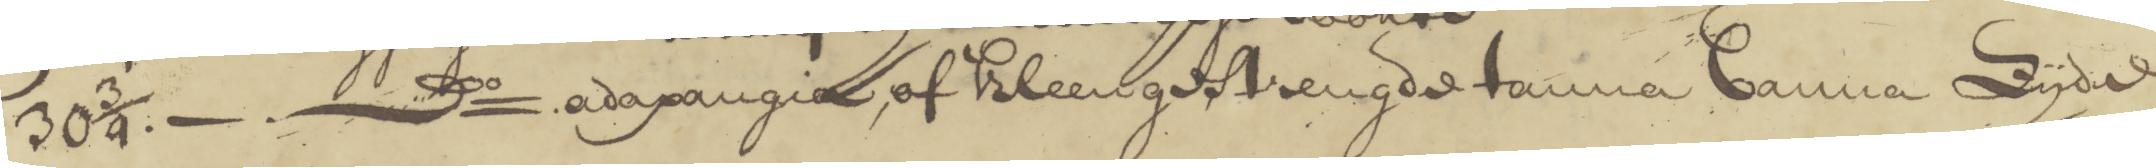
30¼. — D=o adapangia, of kleen gestrengde tanna banna zijde
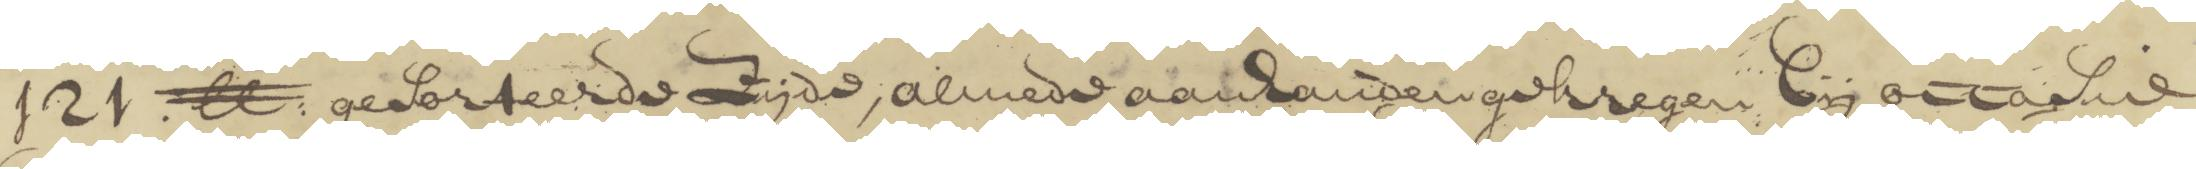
121: lb: gesorteerde zijde; almede aanhanden gekregen bij occasie
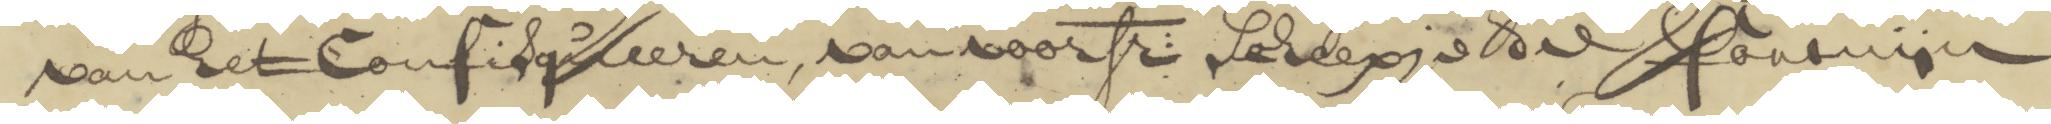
van het confisqueeren, van voorsz: scheepje de fortuijn
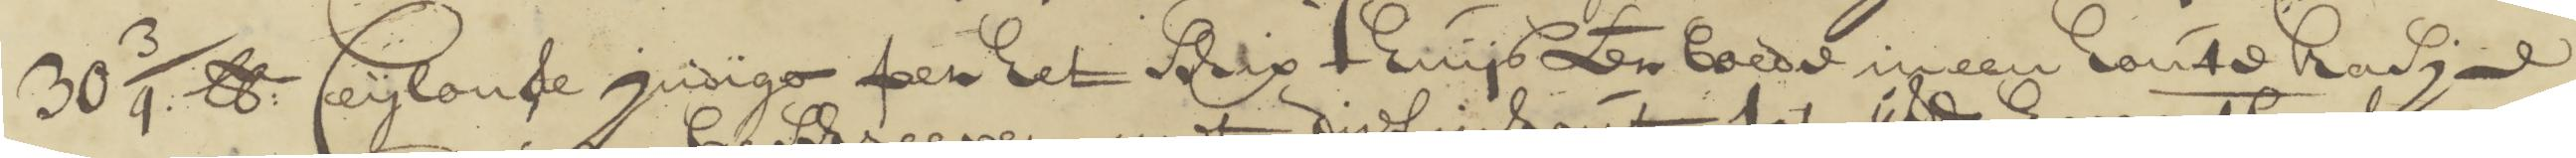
30¼. lb: Ceijlonse indigo per het schip 't huijs ter boede in een houte kasje
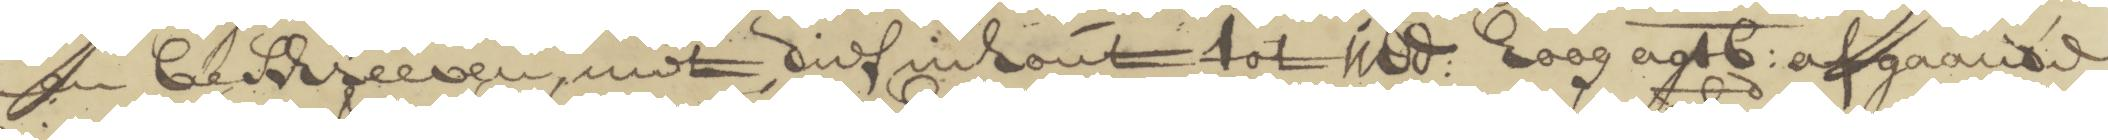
en beschreeven, met dies inhout tot uEd: hoog agtb: afgaande,
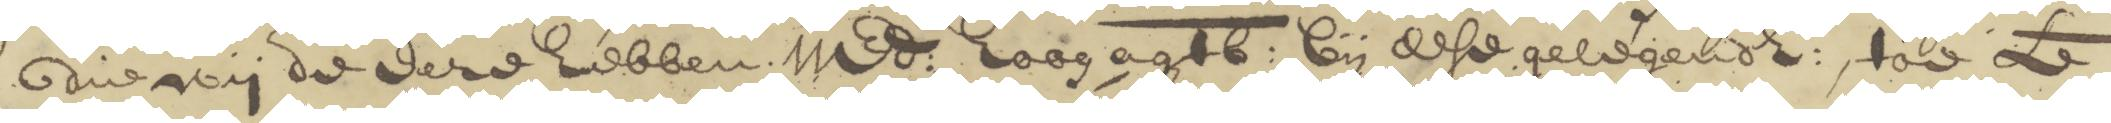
die wij de Eere hebben. UEd: hoog agtb: bij dese gelegendh:d, toe te
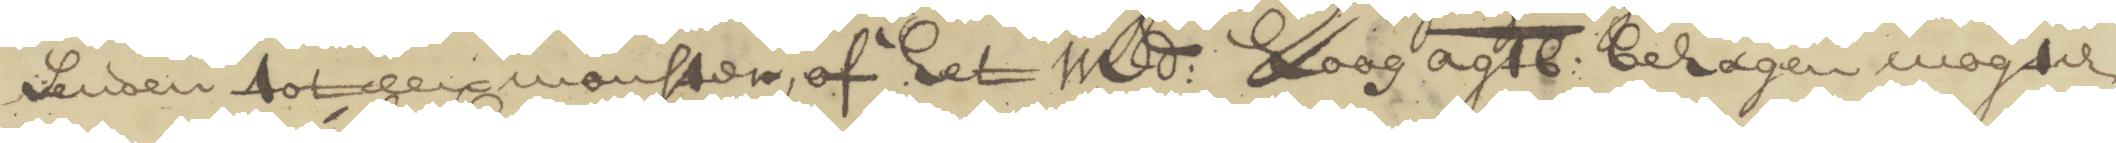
senden tot een monster, of het uEd: Hoog agtb: behagen mogten,
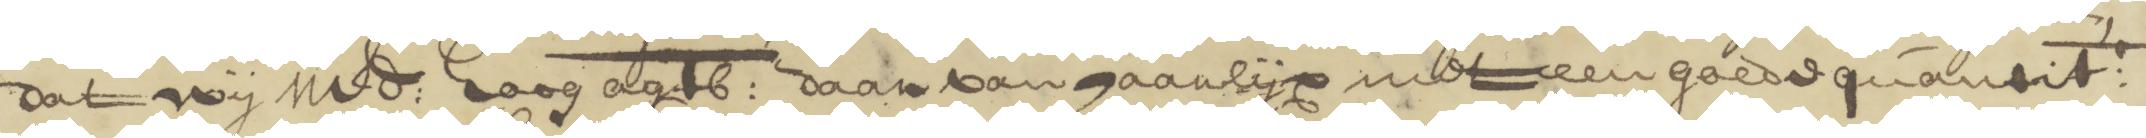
dat wij uEd: hoog agtb: daar van jaarlijx met een goede quantit:t
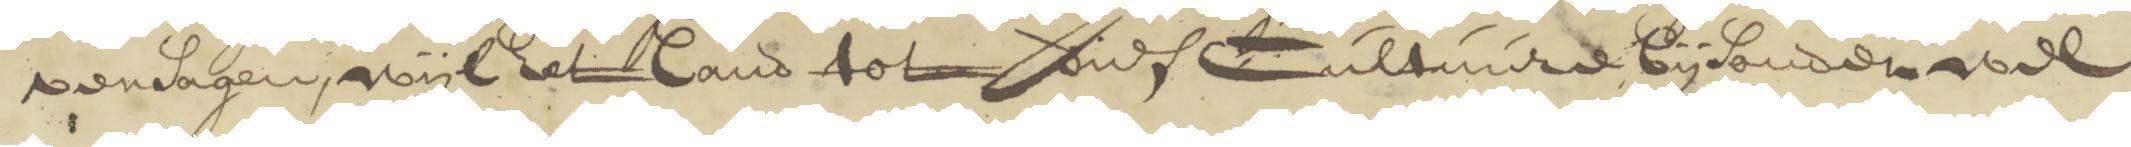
versagen, wijl het land tot dies cultuure bij sonder wel
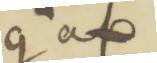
g'ap
